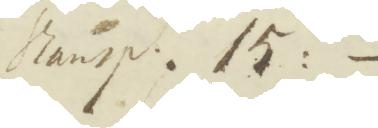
Transp.t ƒ 15: —
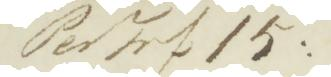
Per Trp ƒ 15:
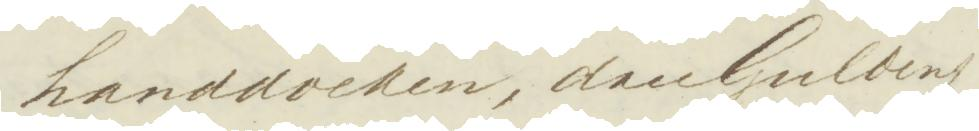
handdoeken, drie Guldens
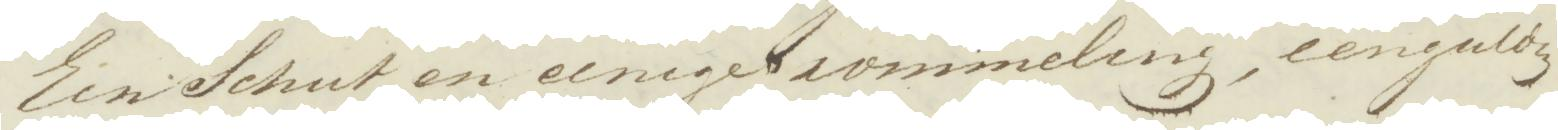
Een schut en eenige rommeling, een gulden
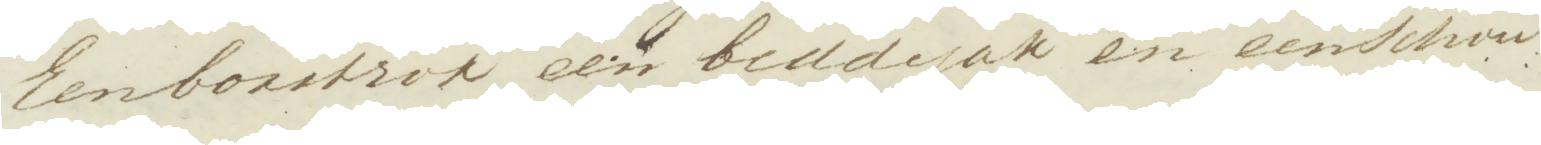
Een borstrok, een beddejak en een schou
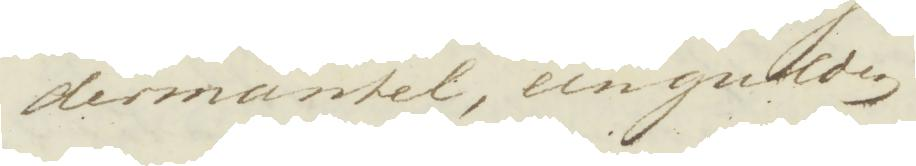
dermantel, een gulden
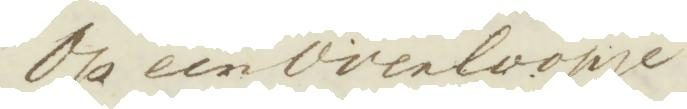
Op een overloopje
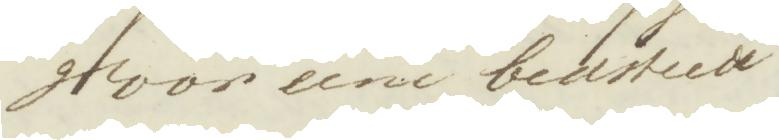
Voor eene bedsteede
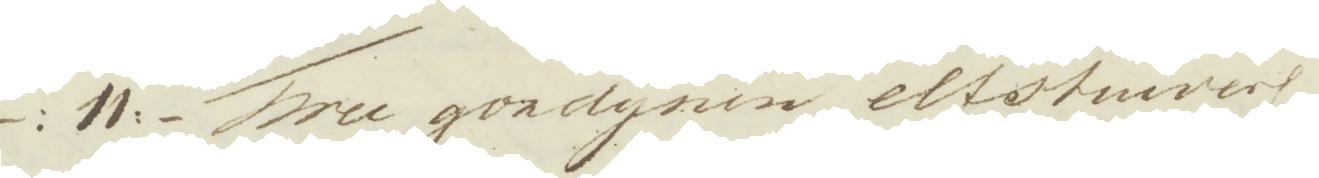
—: 11: — Twee gordynen, elf stuivers
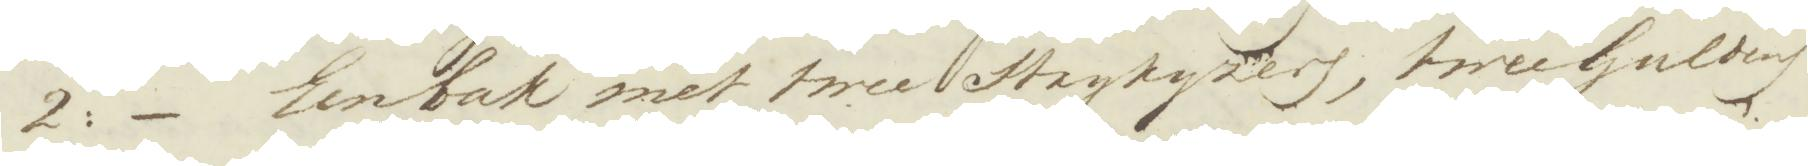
2: — Een bak met twee strykyzers, twee Guldens
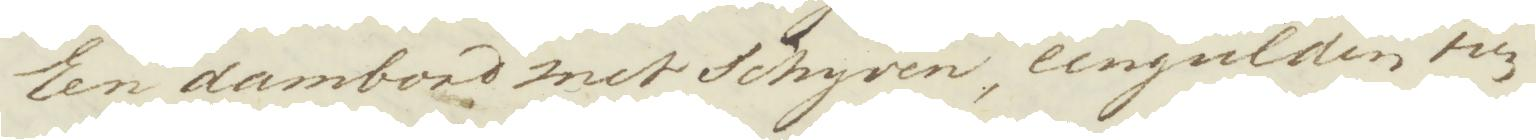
Een dambord met schyven, een gulden tien
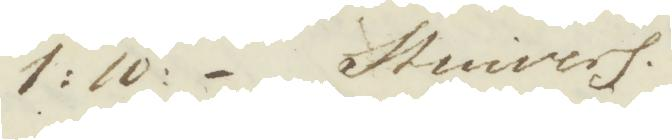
1: 10: — stuivers.
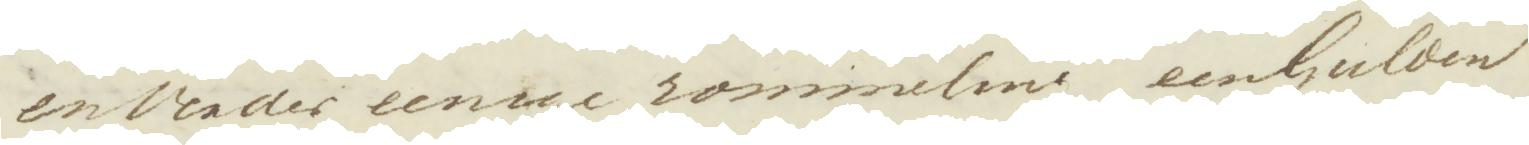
en verder eenige rommeling, een Gulden
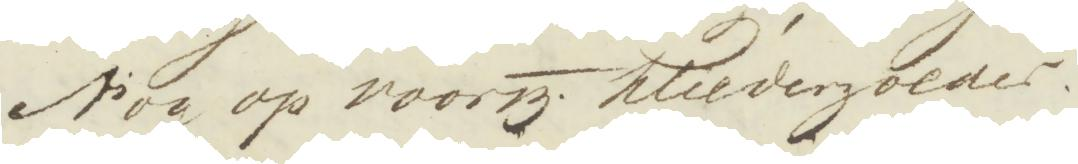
Nog op voors. kleederzolder.
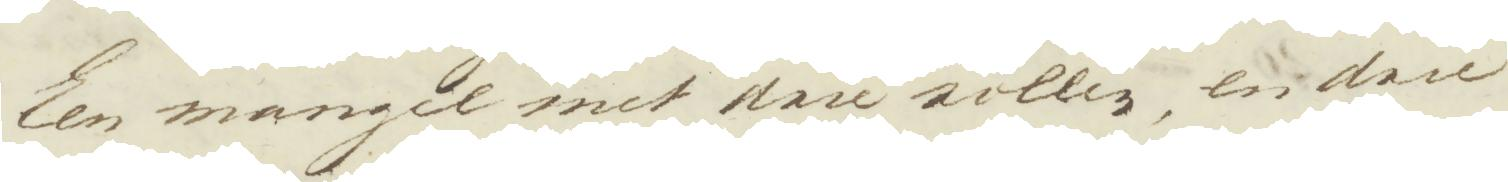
Een mangel met drie rollen, en drie
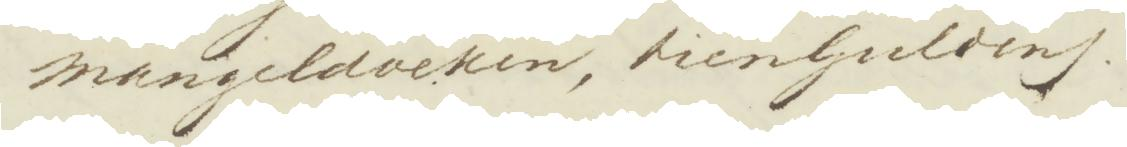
mangeldoeken, tien Guldens.
